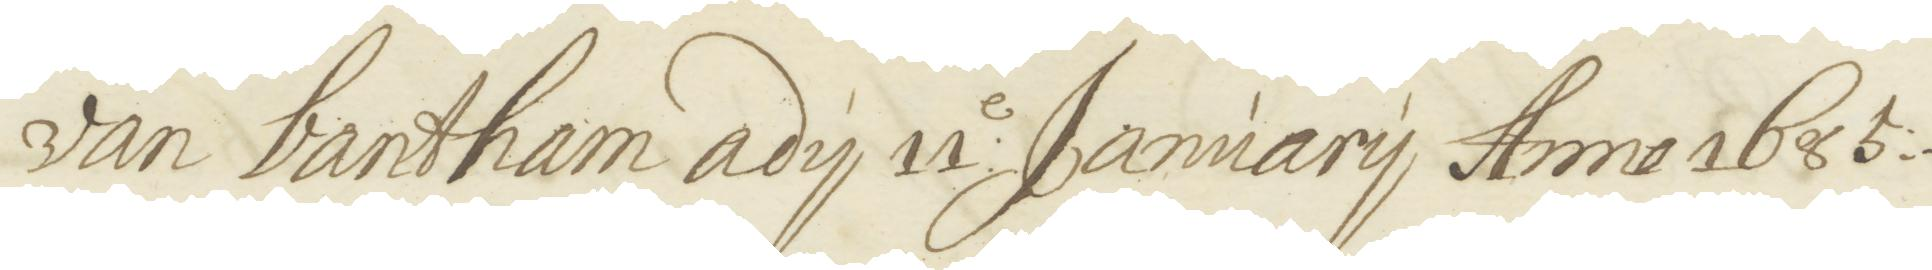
Van Bantham adij 11: Januarij Anno 1685:
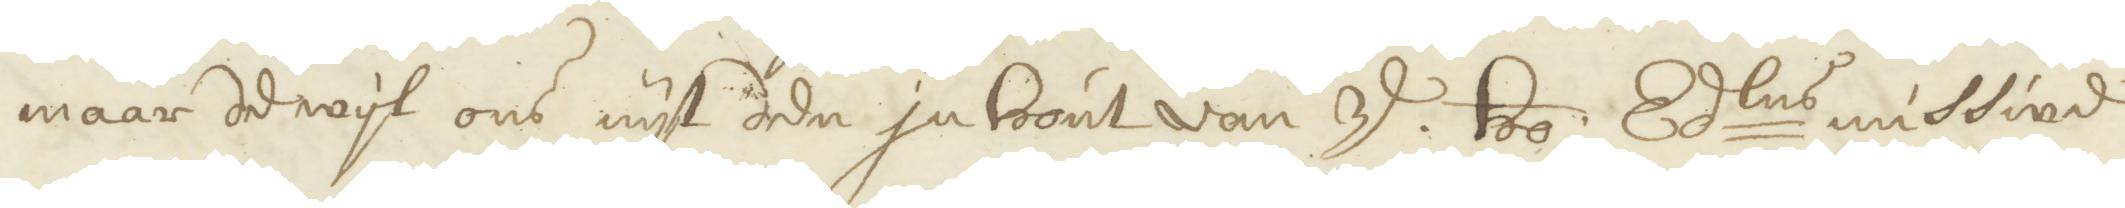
maar dewijl ons uijt den jnhout van V. ho: Ed=lns missive
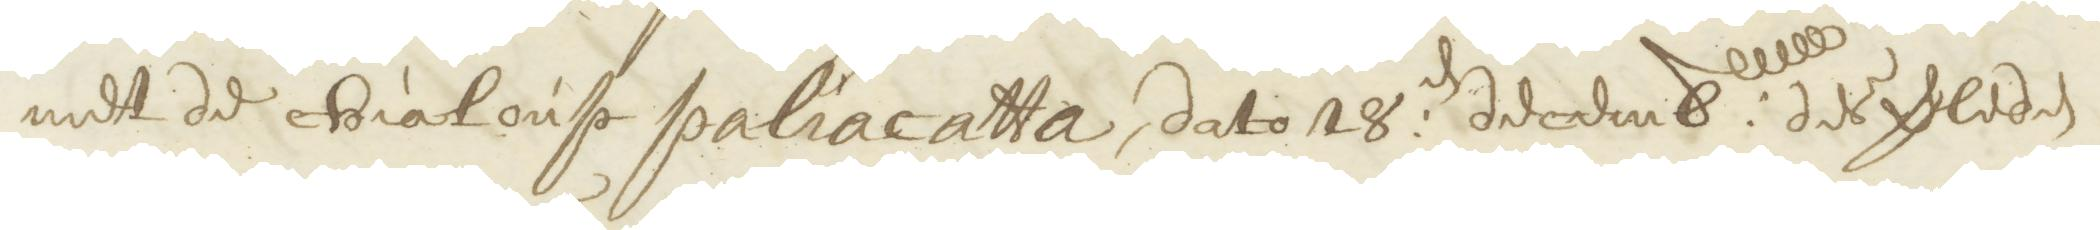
met de chialous paliacatta, dato 18:en decemb:' des verleden
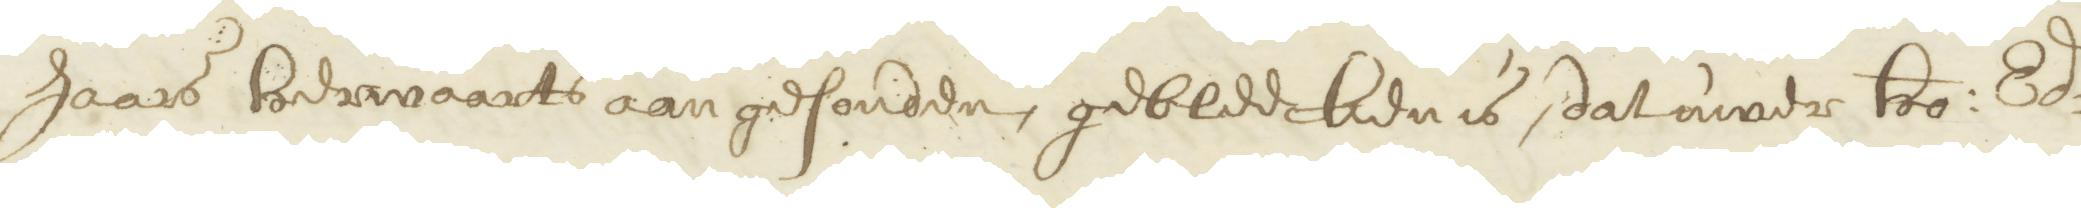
Jaars herwaarts aan gesonden, gebleecken is, dat uwer ho: Ed=lns
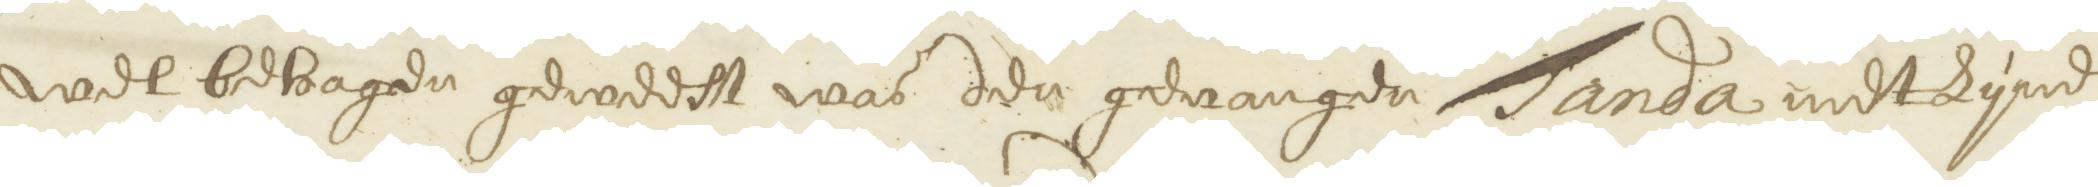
wel behagen geweest was den gevangen Tanda met Zijne
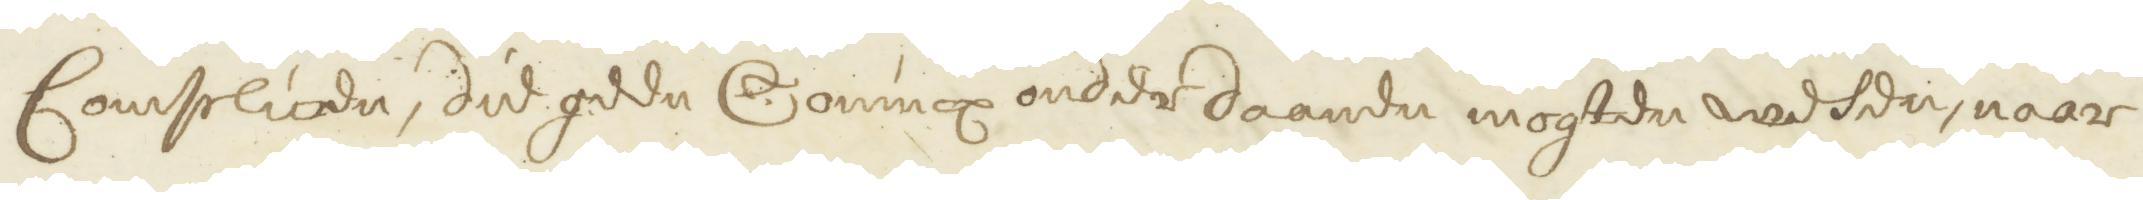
Complicen, die geen Conincx onderdaanen mogten wesen, naar
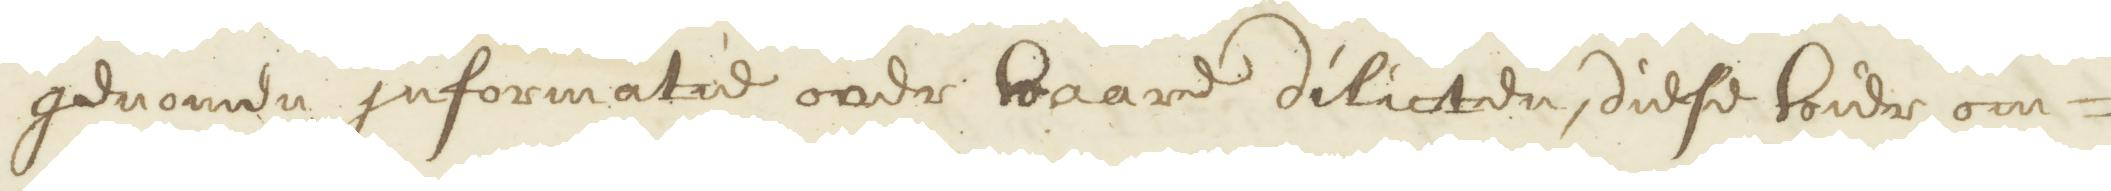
gewonnen jnformatie over haare dilicten, diese hier om=
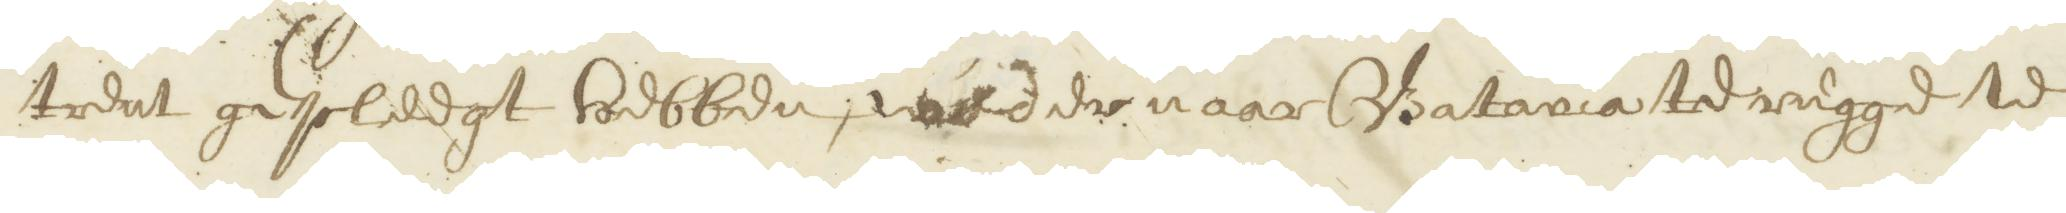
trent gepleegt hebben, weder naar Batavia te rugge te
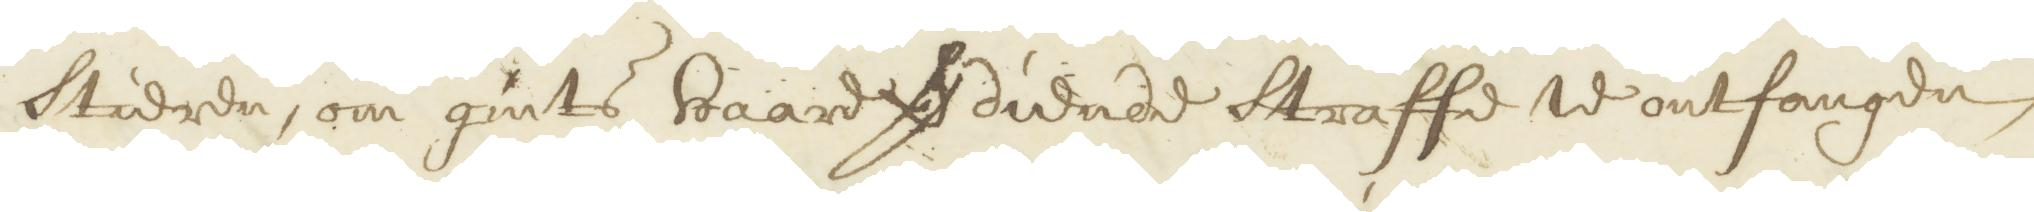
stieren, om gints haare verdiende straffe te ontfangen,
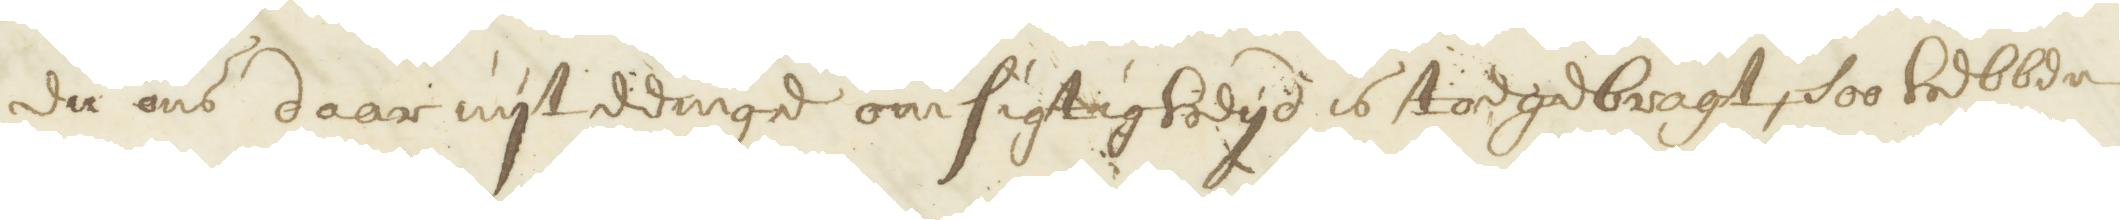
en ons daar uijt eenige om sigtigheijd is toegebragt, soo hebben
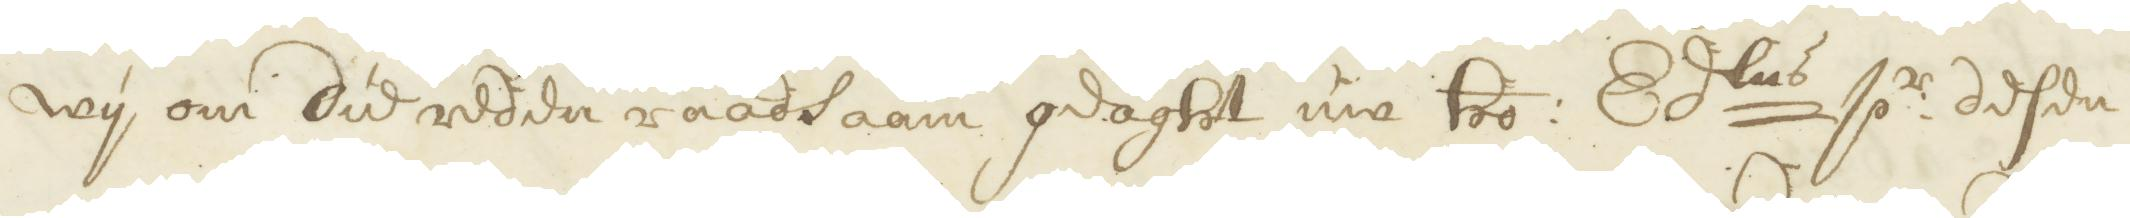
wij om die reden raadsaam geaght uw ho: Ed=lns p:r desen
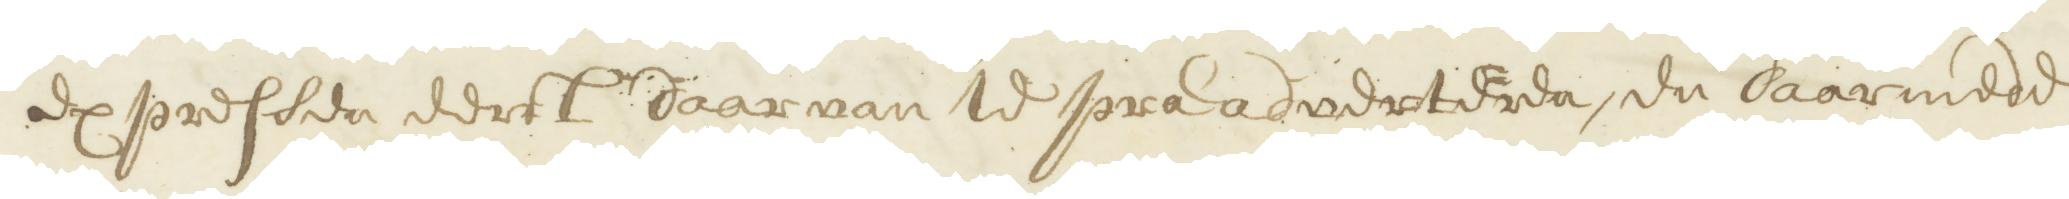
Expressen eerst daarvan te praeadverteren, en daarmede
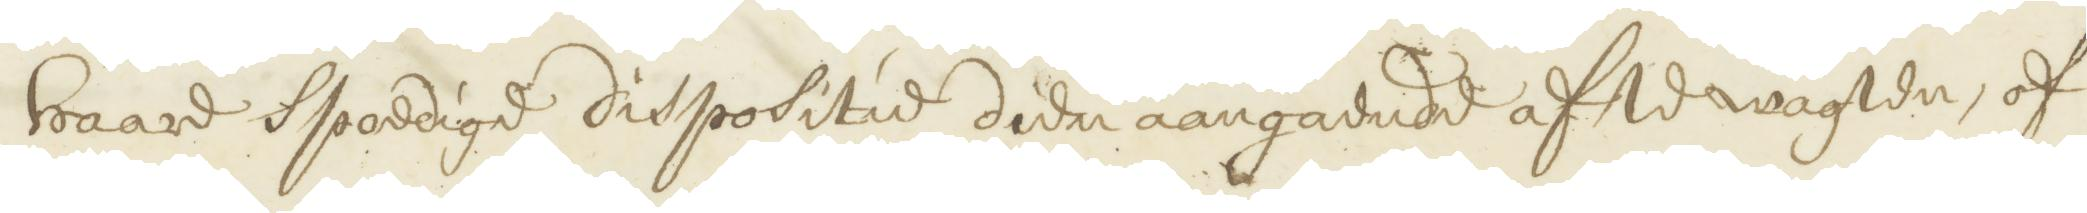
haare spoedige dispositie dien aangaende afte wagten, of
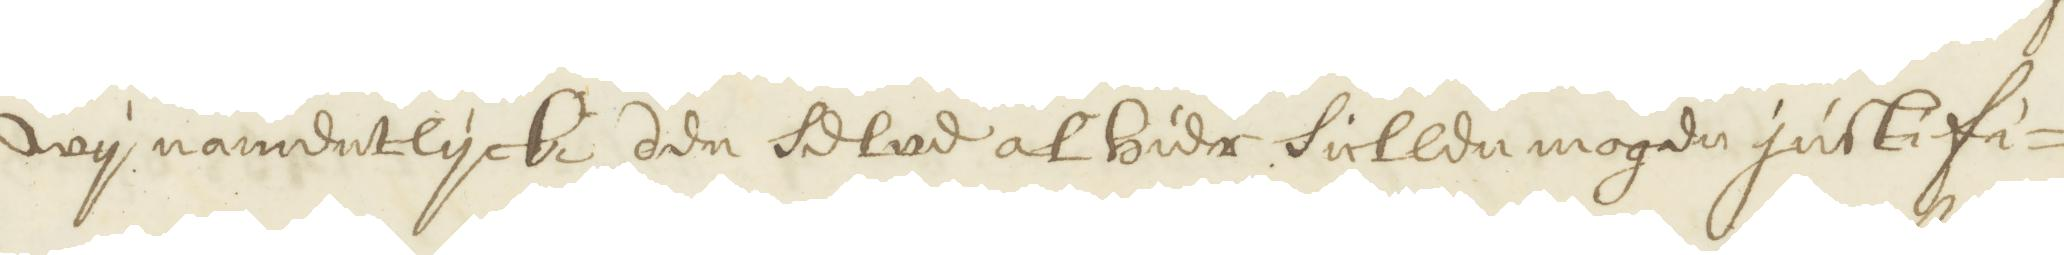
wij namentlijck den selve alhier sullen mogen justifi=
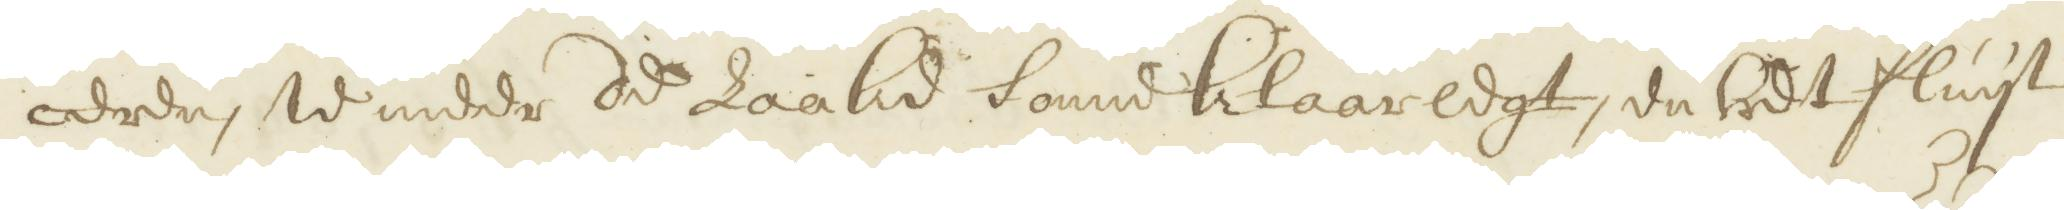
ceren, te meer de Zaake sonne klaar legt, en het fluijt
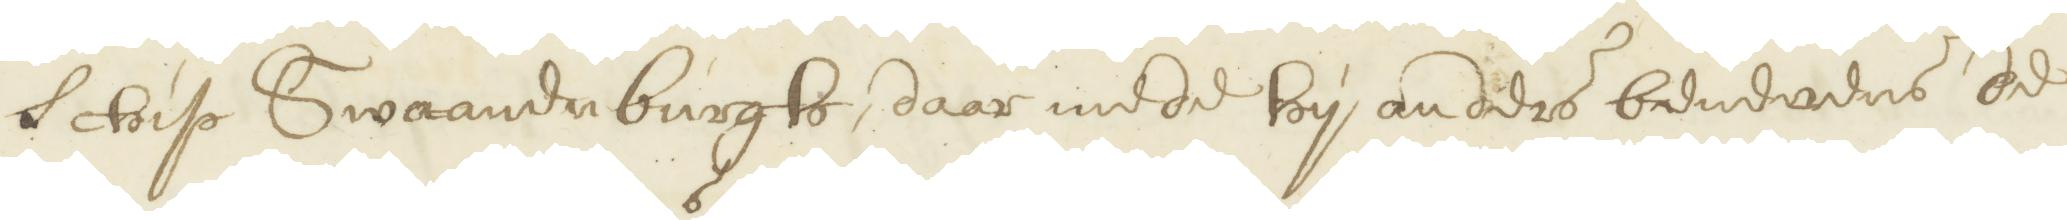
schip Swaanenburgh, daar mede hij anders benevens de
